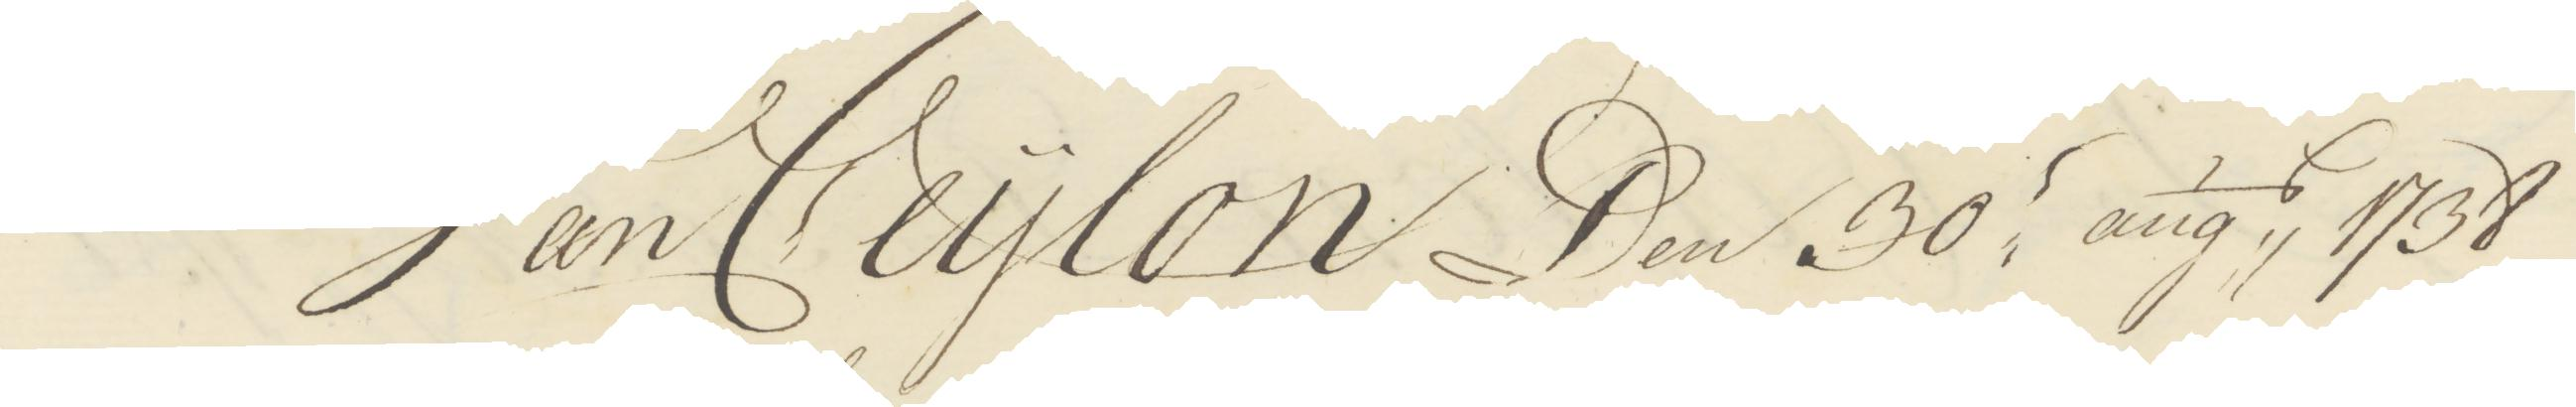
Van Ceijlon Den 30„' aug„s 1738
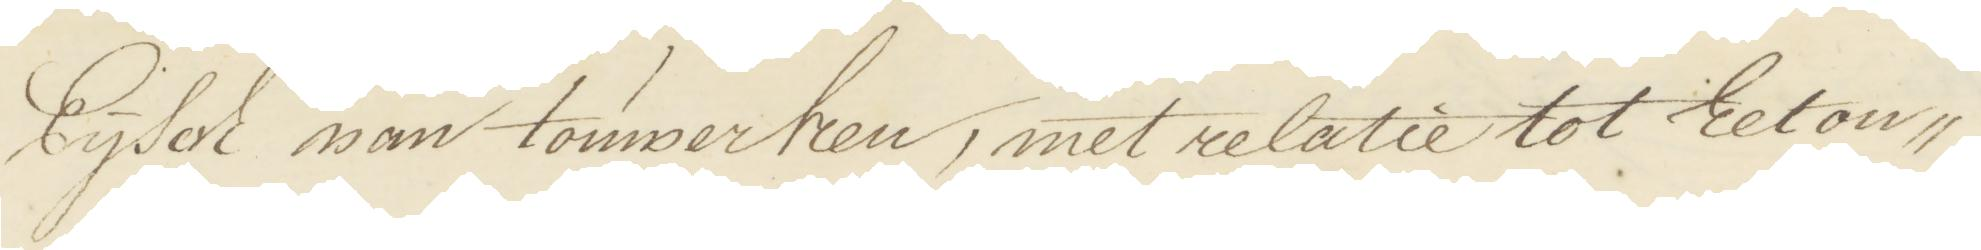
Eijsch van touwerken, met relatie tot het on„
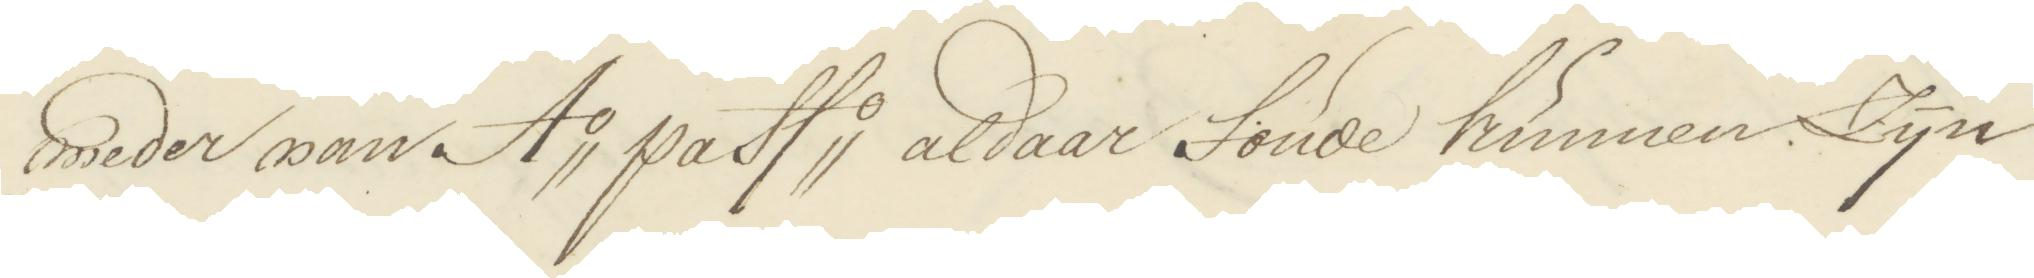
weder van A„o pass„o aldaar soude kunnen zijn
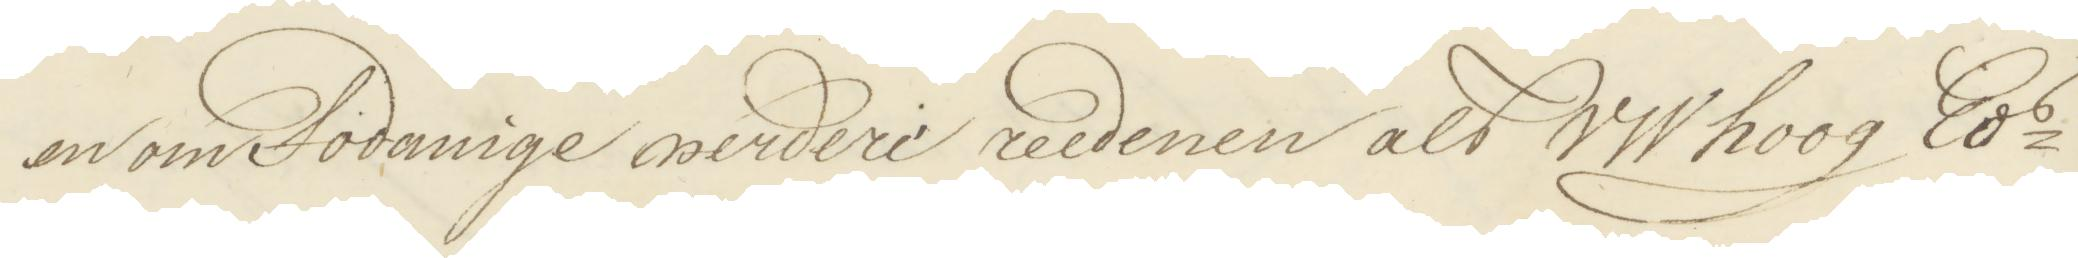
en om sodanige verdere reedenen als VW hoog Ed=s
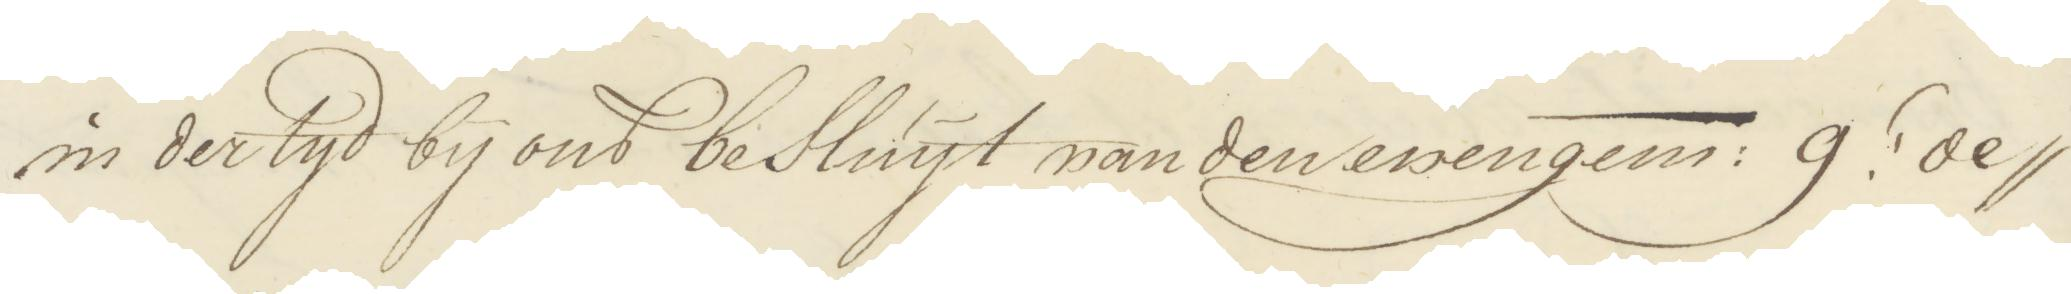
in der tyd bij ons besluijt van den evengem: 9:' de„
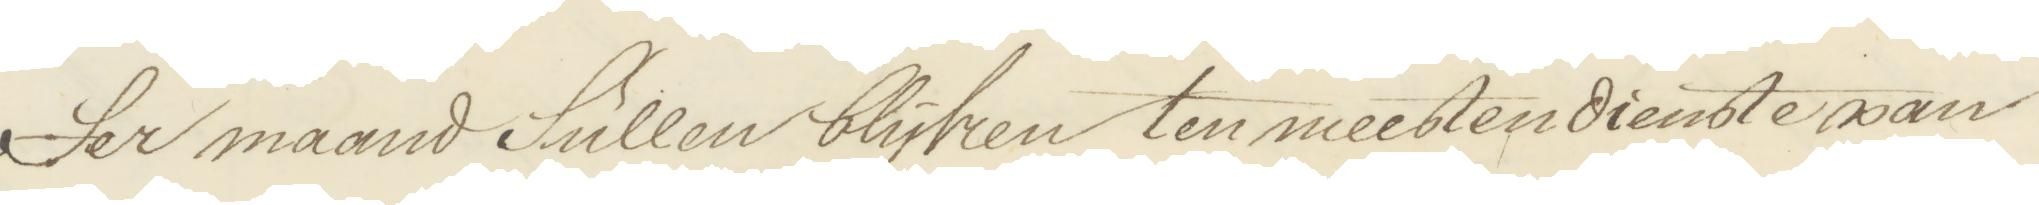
ser maand sullen blijken ten meesten dienste van
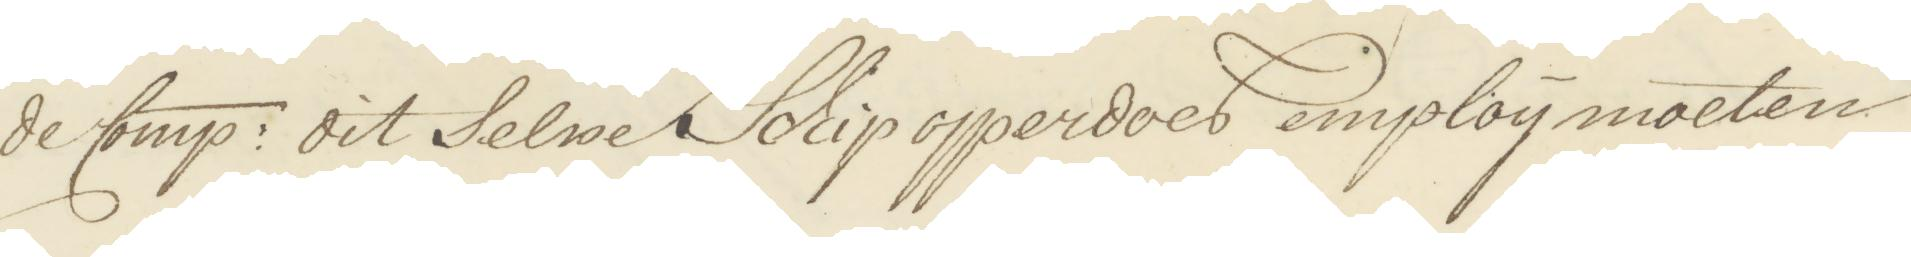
de Comp: dit selve schip opperdoes emploij moeten
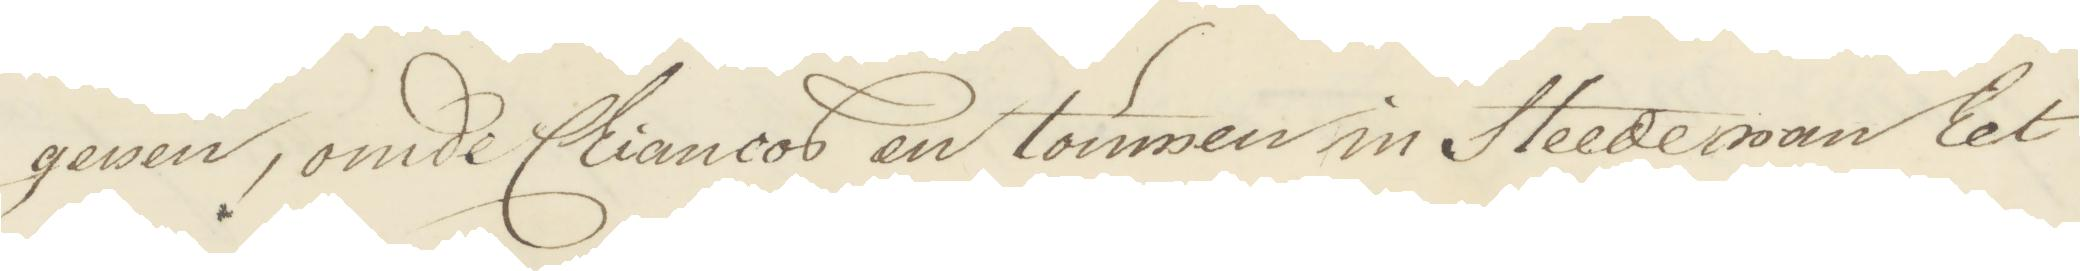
geven, omde Chiancos en touwen in steede van het
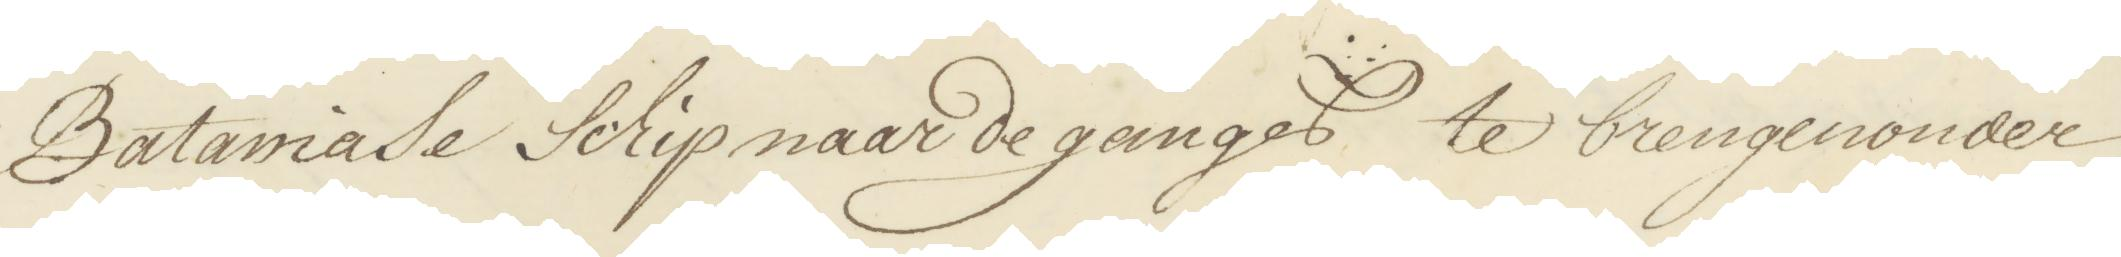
Bataviase schip naar de ganges te brengenonder
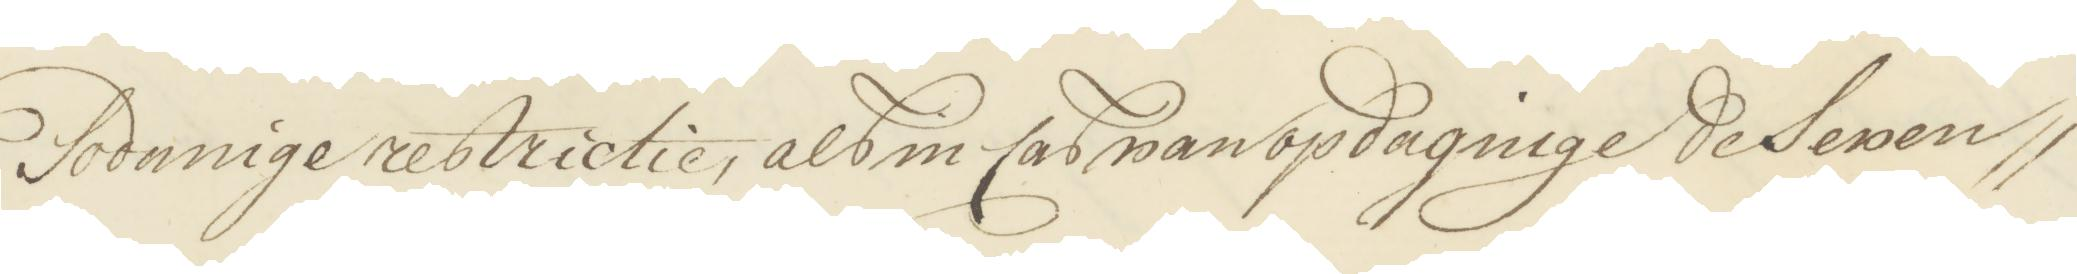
sodanige restrictie, als in Cas van op daginge de seven„
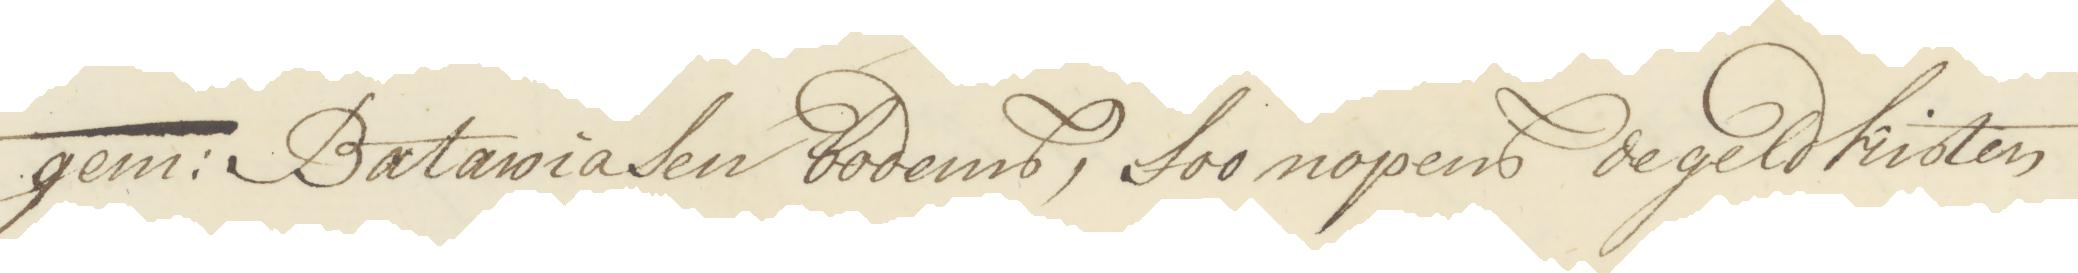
gem: Bataviasen bodems, soo nopens de geldkisten
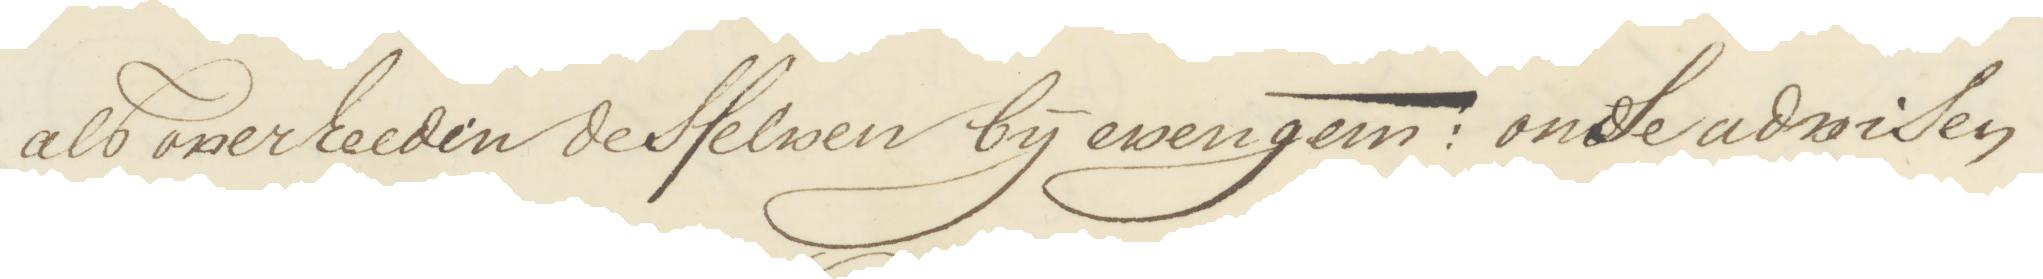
als overheeden desselven bij evengem: onse advisen
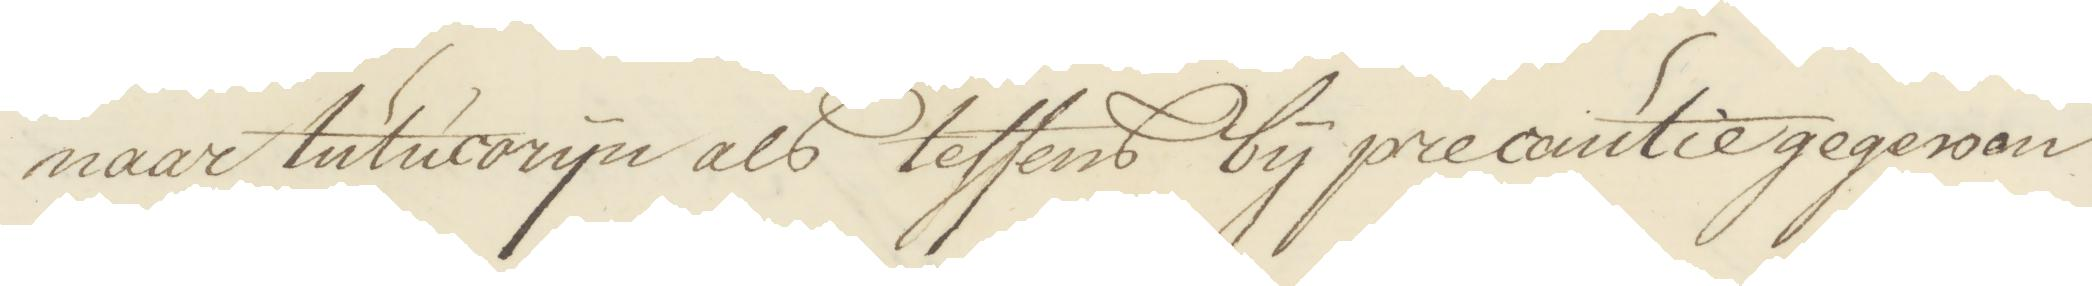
naar tutucorijn als teffens bij precautie gegeven
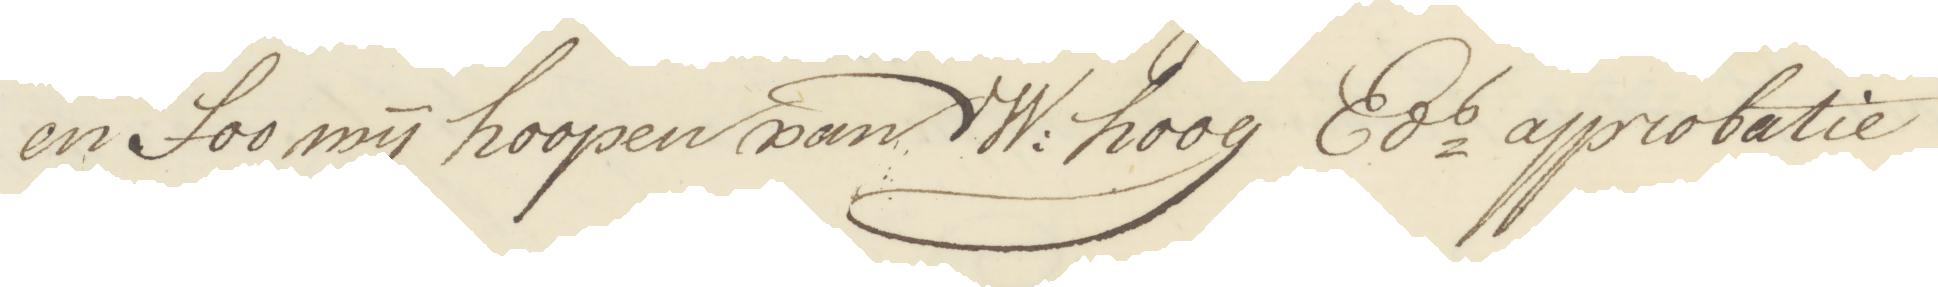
en soo wij hoopen van VW: hoog Ed=s approbatie
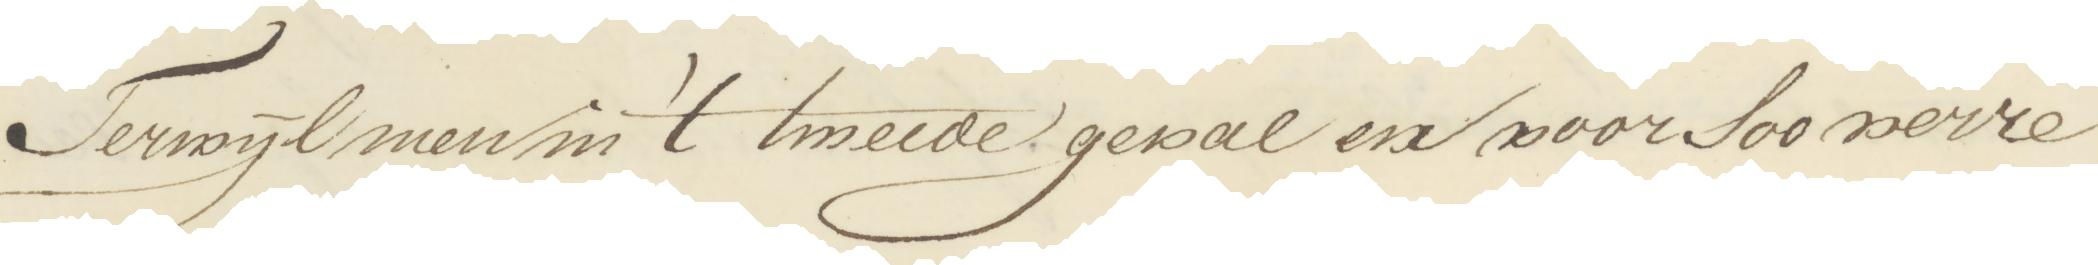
Terwijl men in ’t tweede geval en voor soo verre
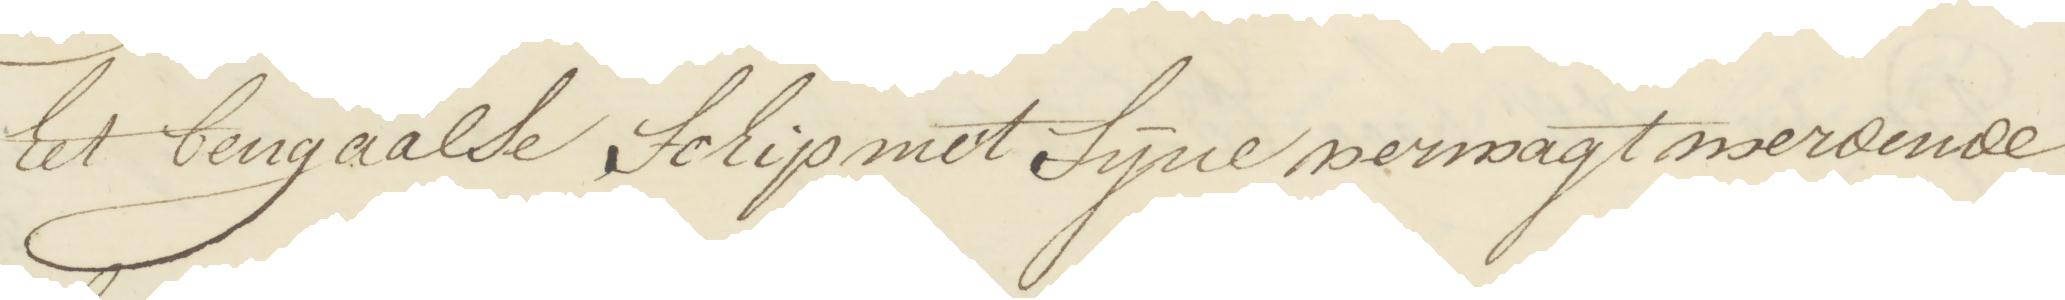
het bengaalse schip met sijne verwagt werdende
